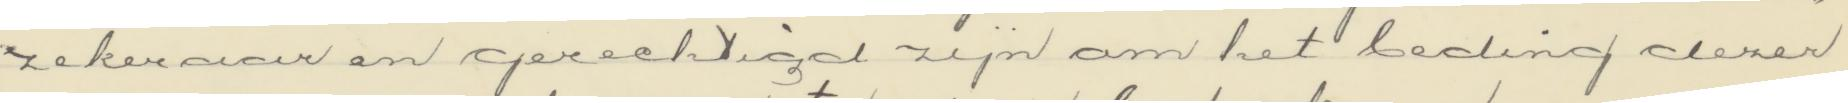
zekeraar en gerechtigd zijn om het beding dezer
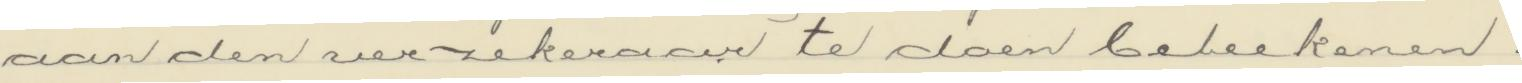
aan den verzekeraar te doen beteekenen
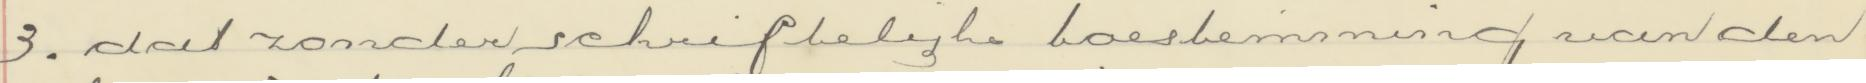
3. dat zonder schriftelijke toestemming van den
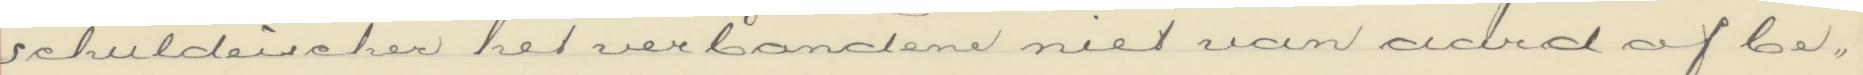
schuldeischer het verbondene niet van aard of be„
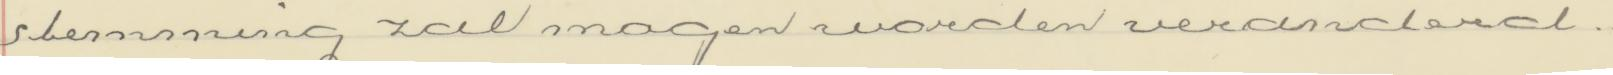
stemming zal magen worden veranderd.
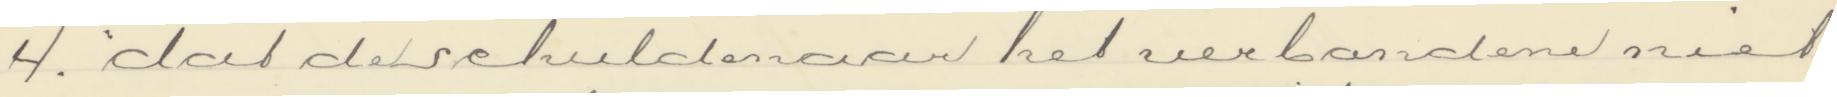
4. dat de schuldenaar het verbondene niet
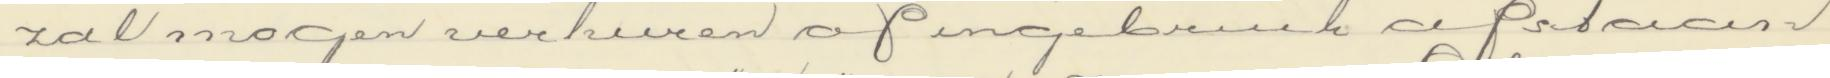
zal mogen verhuren of ingebruik afstaan
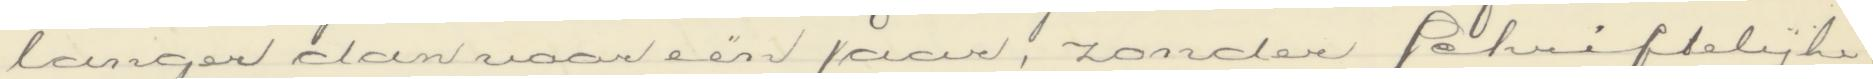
langer dan voor een jaar, zonder schriftelijke
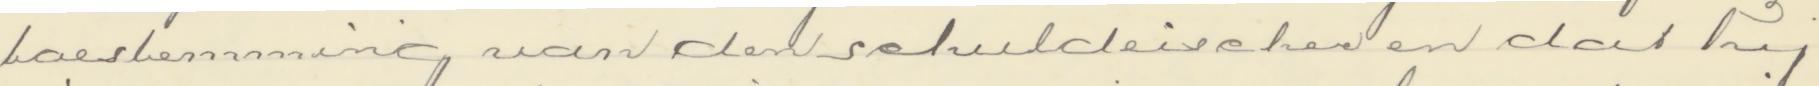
toestemming, van den schuldeischer en dat hij
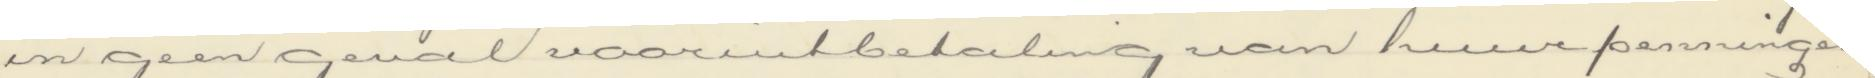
in geen geval vooruitbetaling van huurpenningen
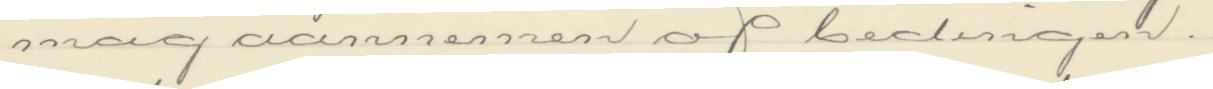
mag aannemen of bedingen.
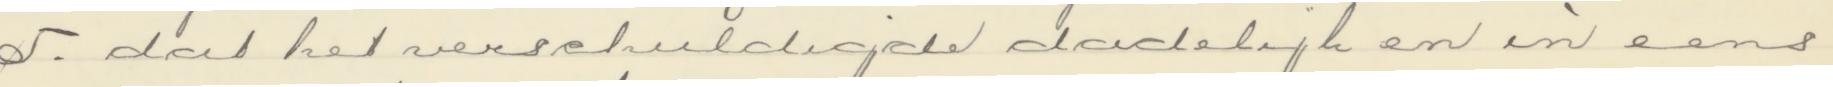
5. dat het verschuldigde dadelijk en in eens
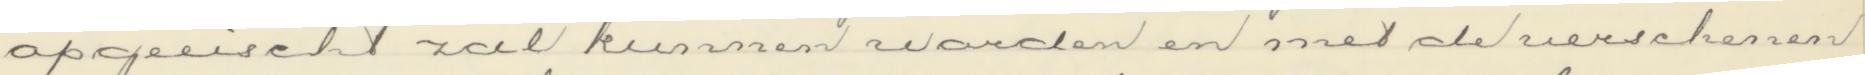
opgeeischt zal kunnen worden en met de verschenen
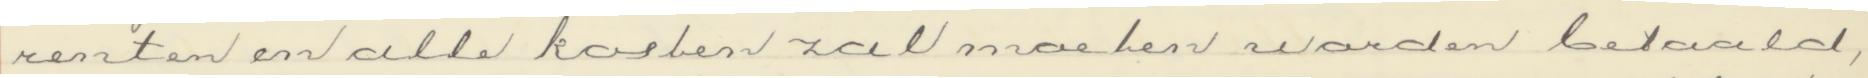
renten en alle kosten zal moeten worden betaald
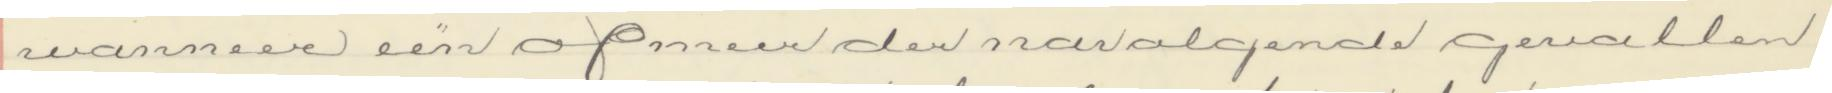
wanneer één of meer der navolgende gevallen
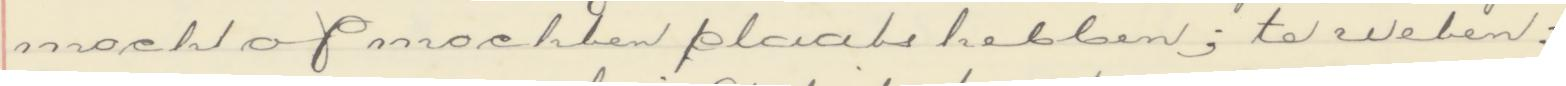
mocht of mochten plaats hebben; te weten:
